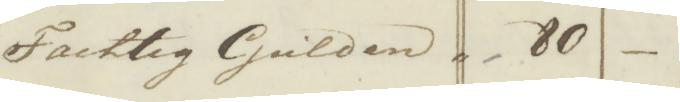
Tachtig Gulden „- 80 —
